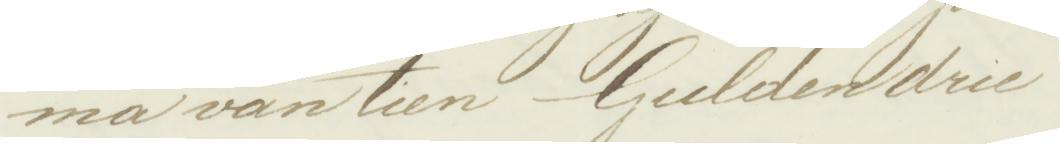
ma van tien Gulden drie
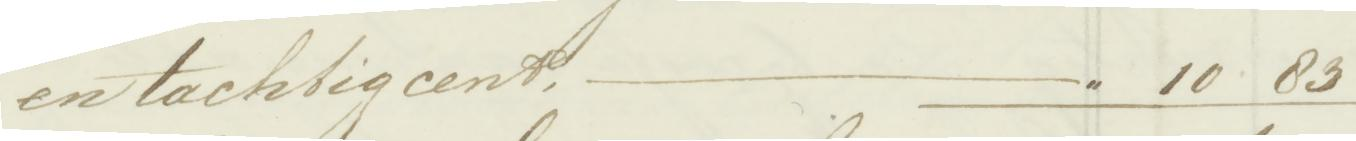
en tachtig cent,—„ 10 83
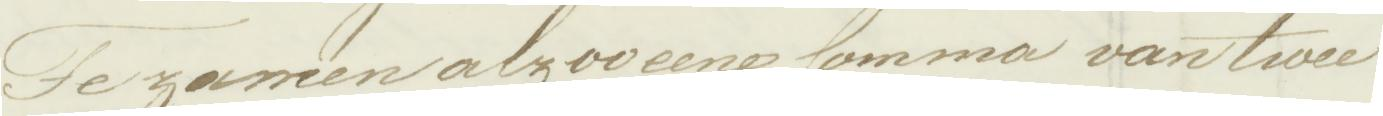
Te zamen alzoo eene somma van twee
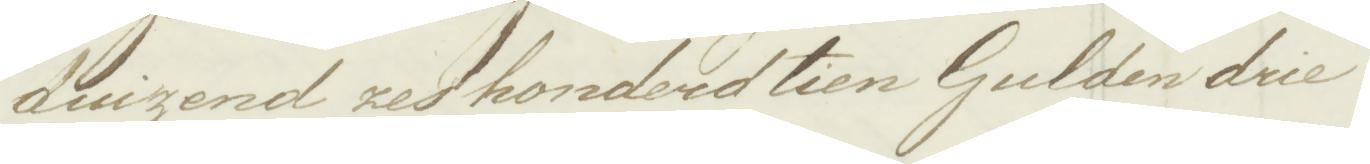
duizend zes honderd tien Gulden drie
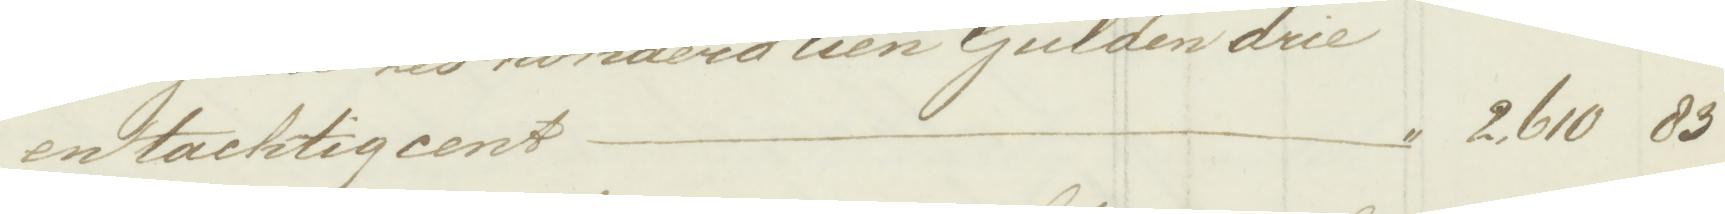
en tachtig cent —„ 2,610 83
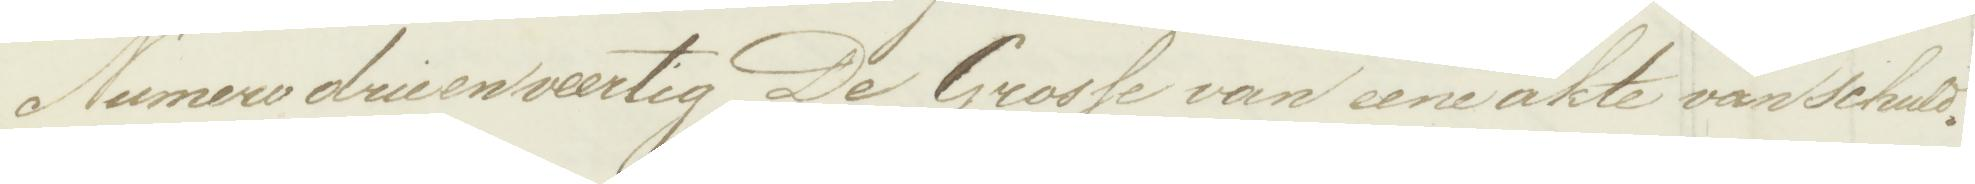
Numero drie en veertig De Grosse van eene akte van Schuld„
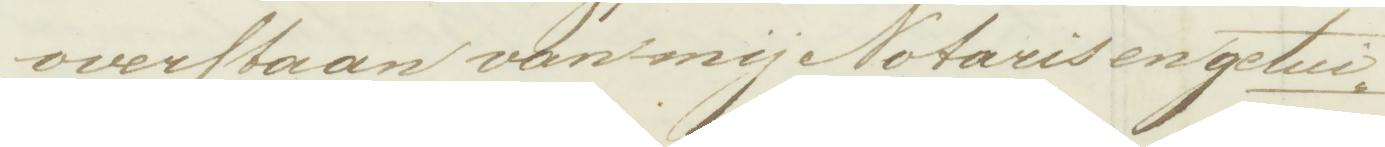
overstaan van my Notaris en getui„
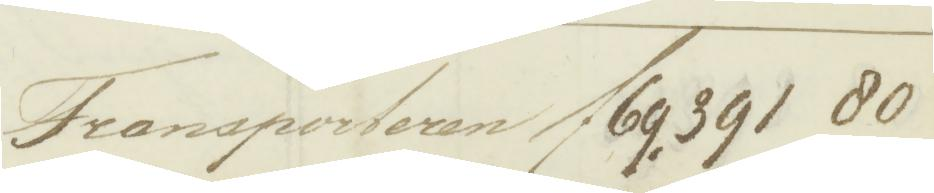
Transporteren ƒ69.391 80
